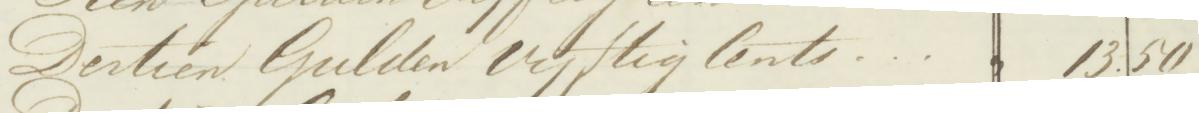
Dertien Gulden vijftig Cents . . . „ 13.50
